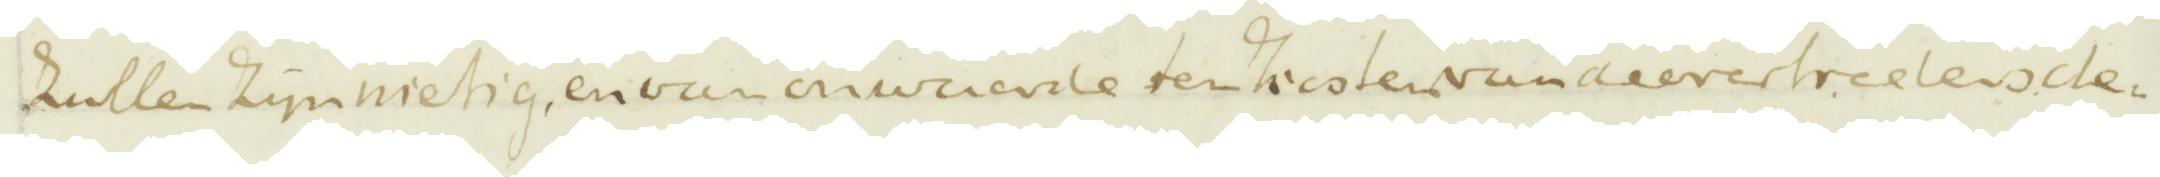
zullen zijn nietig, en van onwaerde ten kosten van de overtreders de„
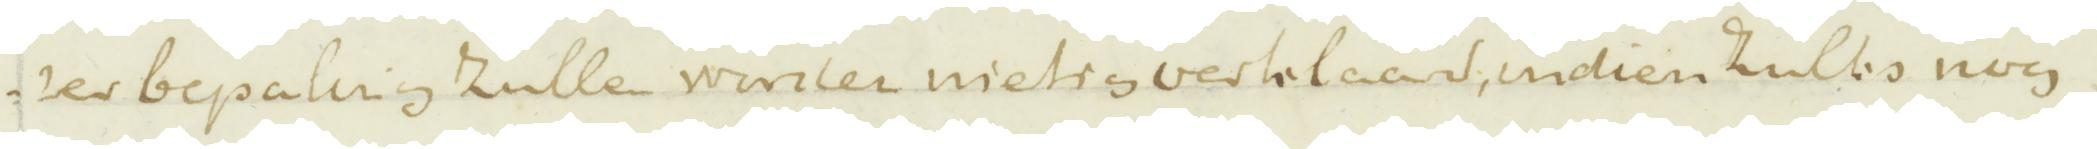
„zer bepaling zullen worden nietig verklaard, indien zulks nog
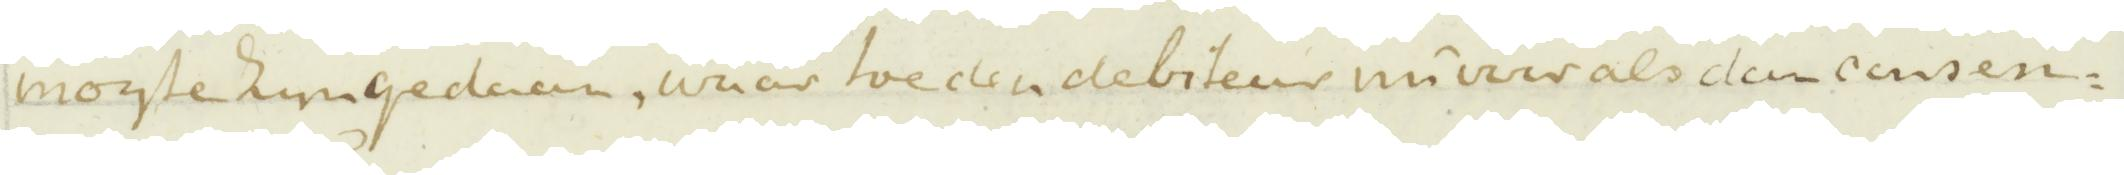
mogte zyn gedaan, waartoe den debiteur nu voor als dan consen„
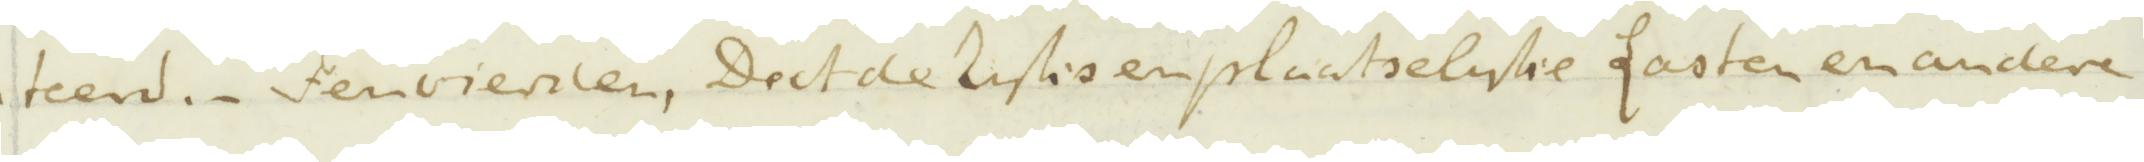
teerd. — Ten vierden, Dat de Ryks en plaatselijke Lasten en andere
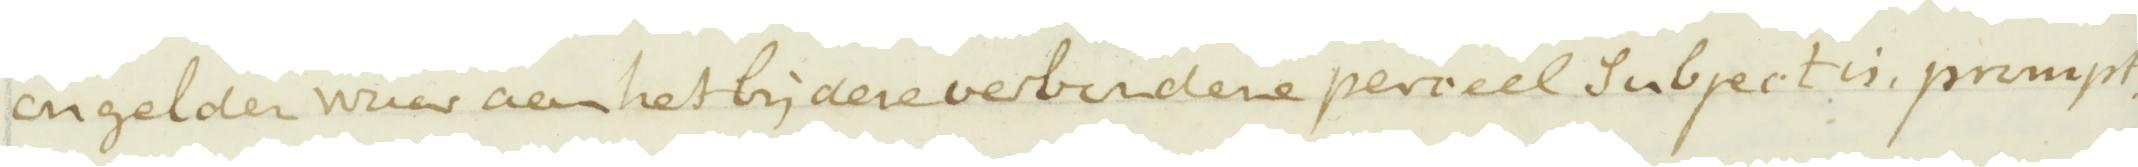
ongelden waar aan het bij dese verbondene perceel Subject is, prompt,
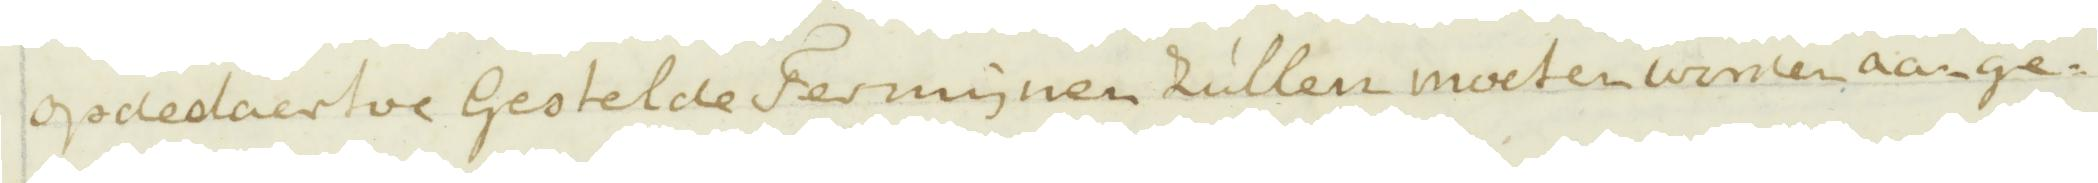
op de daartoe Gestelde Termijnen zullen moeten worden aange„
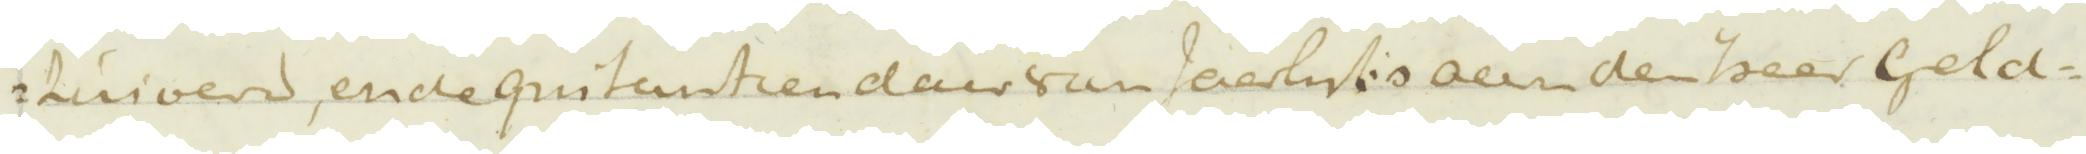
„zuiverd, ende quitantien daer van Jaarlyks aan den Heer Geld„
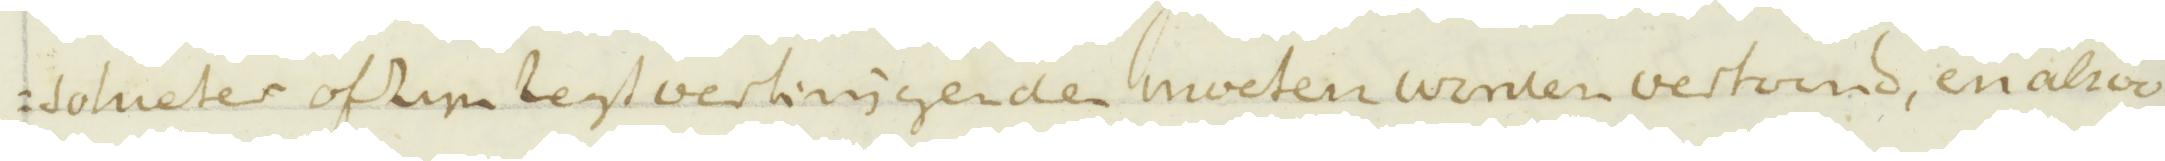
„schieter of Zyn Regt verkrijgenden moeten worden vertoond, en alzoo
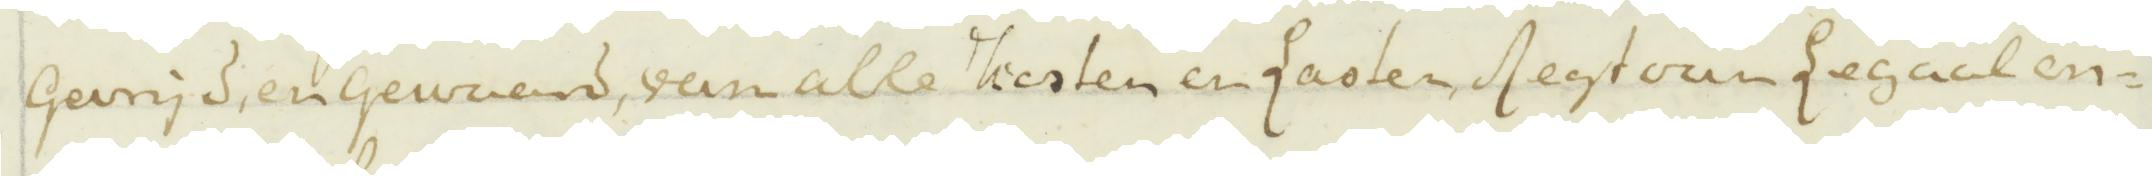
Gevrijd, en Gewaard, van alle Kosten en Lasten, Regt van Legaal on„
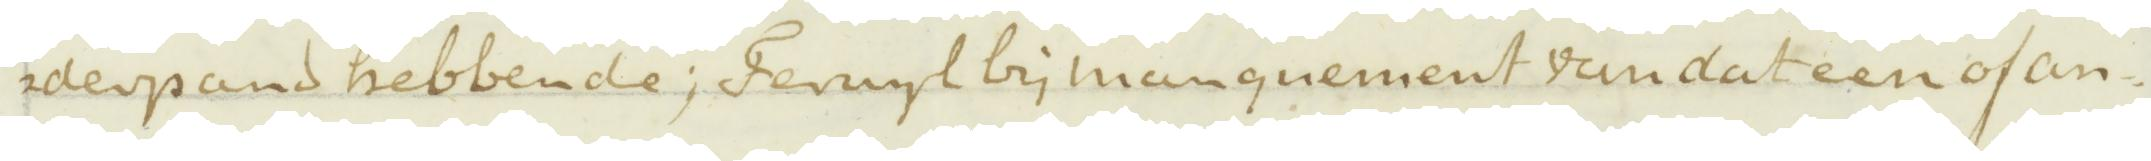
derpand hebbende; Terwyl bij manquement van dat een of an„
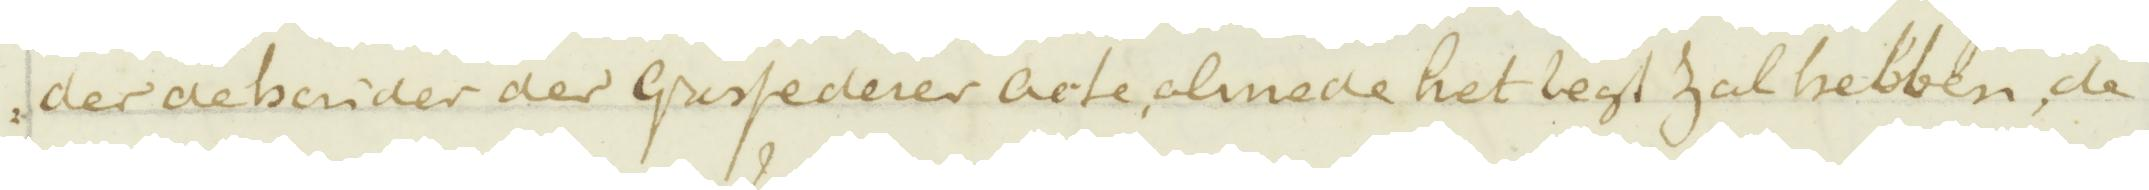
der de houder der Grosse dezer Acte, almede het regt Zal hebben, de
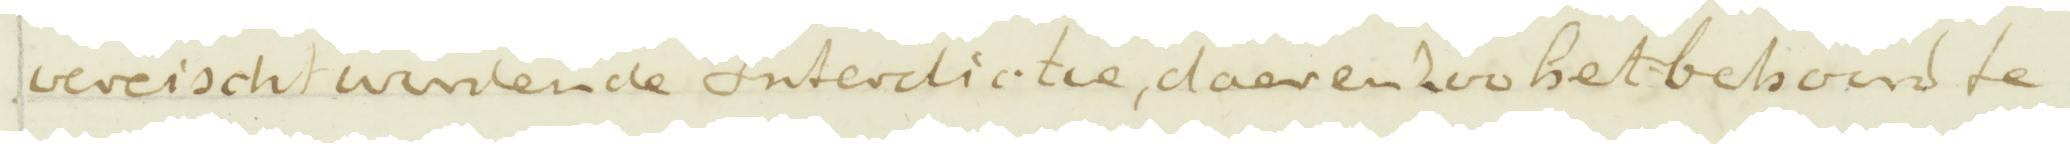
vereischt wordende Interdictie, daer en zoo het behoord te
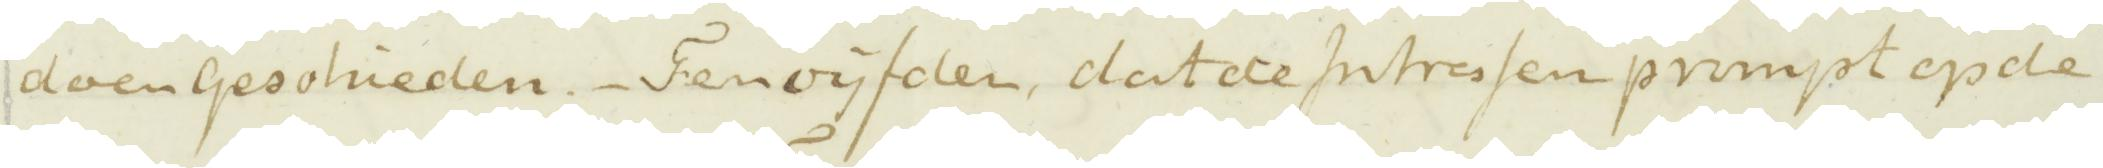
doen Geschieden. - Ten vijfden, dat de Jntressen prompt op de
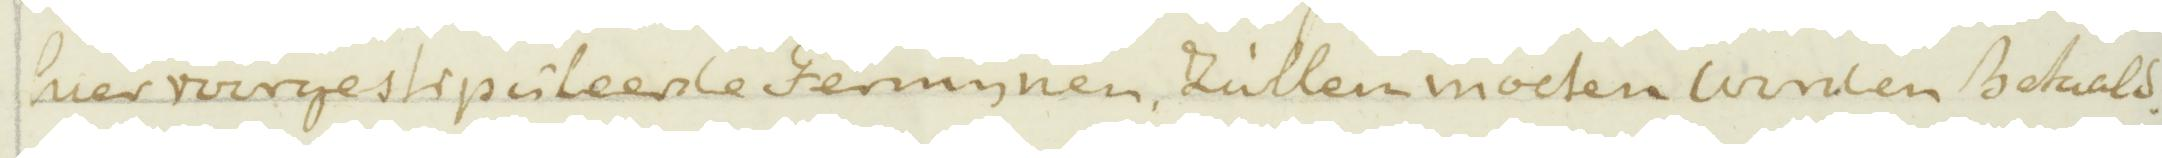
hier voorgestipuleerde Termijnen, zullen moeten worden Betaald.
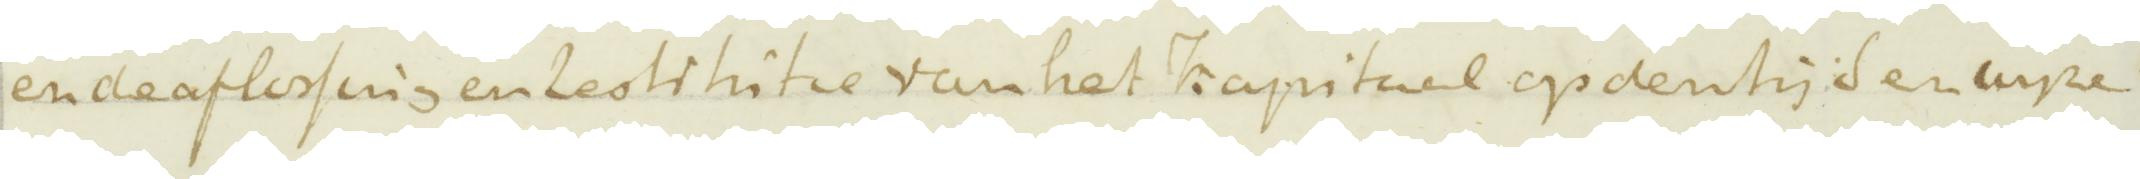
en de aflossing en Restitutie van het Kapitael op den tijd en wyze
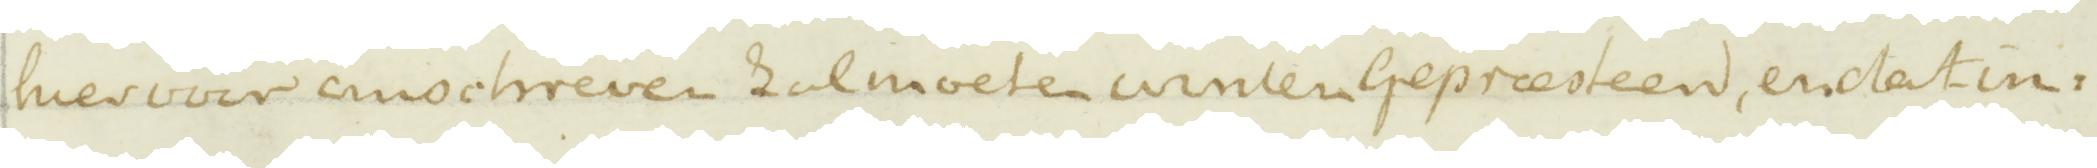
hiervoor omschreven zal moeten worden Gepresteerd, en dat in„
